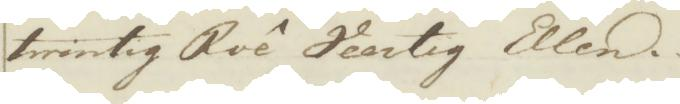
twintig Roê Veertig Ellen.
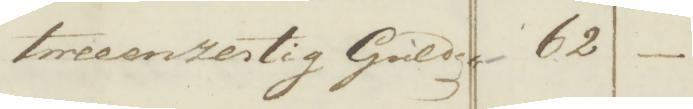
tweeenzestig Gulden „- 62 —
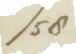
23/58
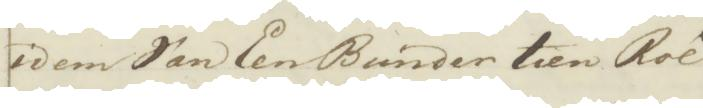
idem Van Een Bunder tien Roê
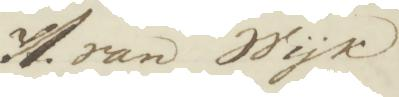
A. van Wijk
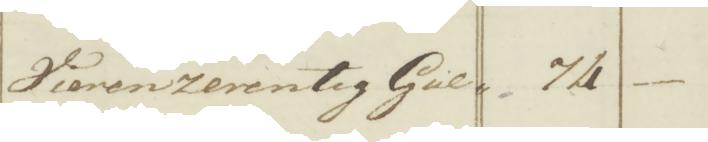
Vierenzeventig Gul„- 74 —
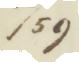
24/59
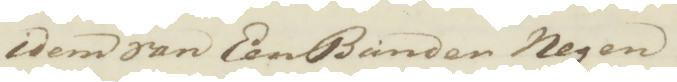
idem van Een Bunder Negen
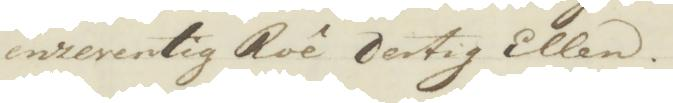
enzeventig Roê dertig Ellen.
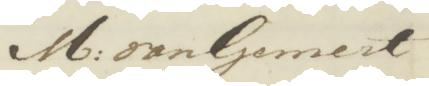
M: van Gemert
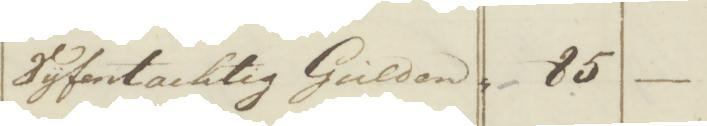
Vijfentachtig Gulden„- 85 —
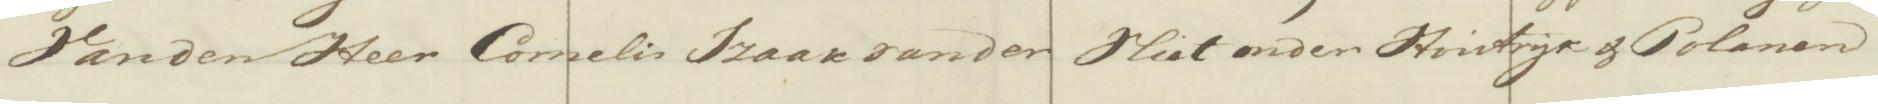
Van den Heer Cornelis Izaak van der Vliet onder Houtrijk & Polanen
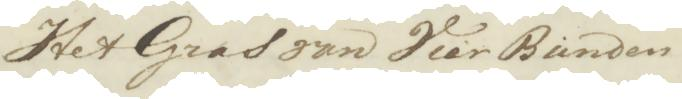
Het Gras van Vier Bunders
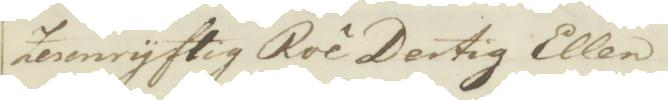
Zesenvijftig Roê Dertig Ellen
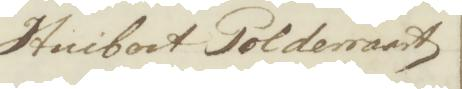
Huibert Poldewaart
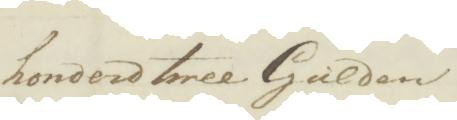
honderd twee Gulden
